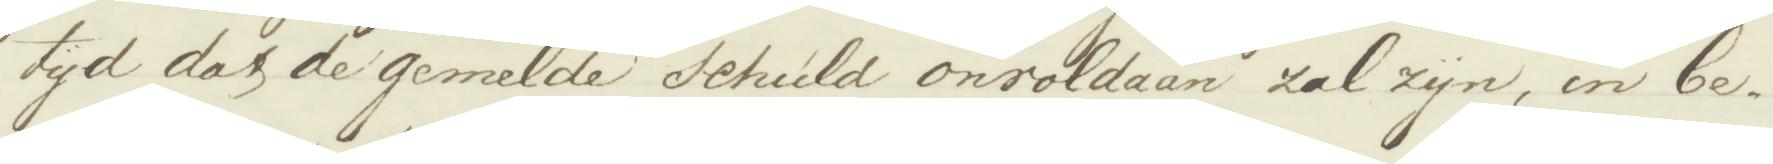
tijd dat de gemelde schuld onvoldaan zal zijn, in be„
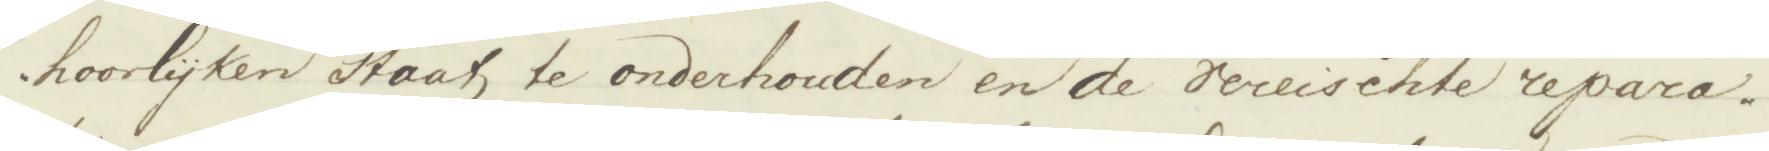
„hoorlijken staat te onderhouden en de vereischte repara„
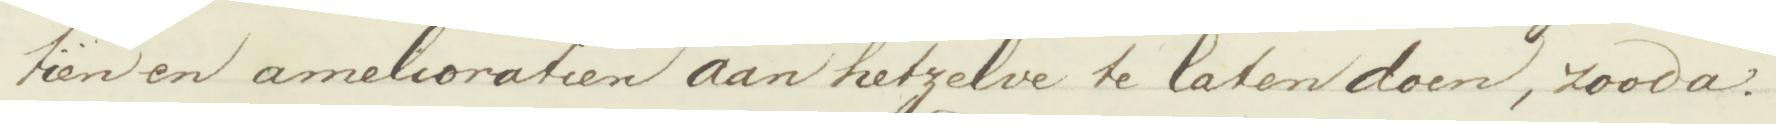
tiën en amelioratiën aan hetzelve te laten doen, zooda„
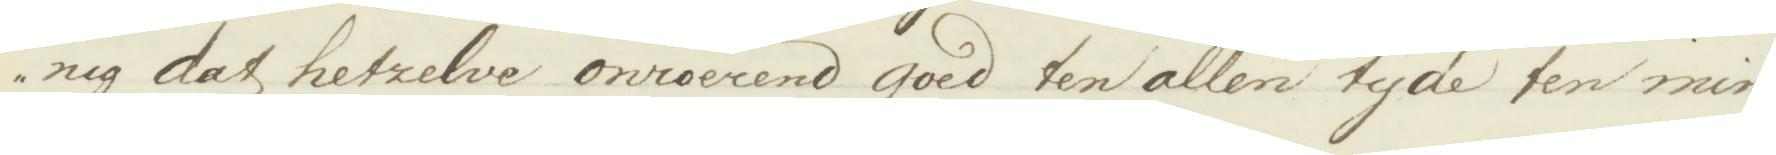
„nig dat hetzelve onroerend goed ten allen tijde ten min
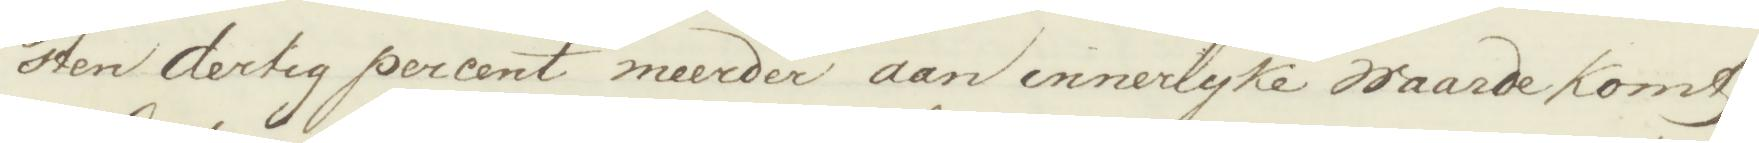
sten dertig percent meerder aan innerlyke waarde komt
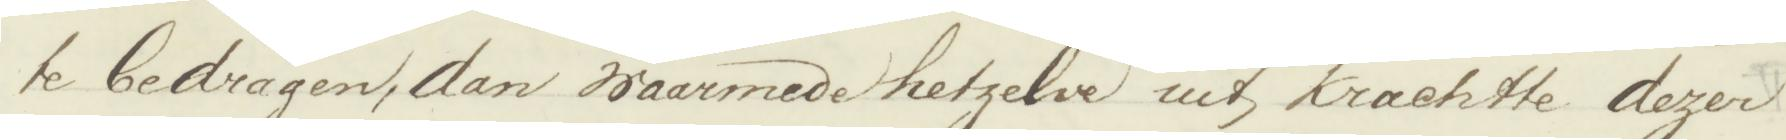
te bedragen, dan waarmede hetzelve uit krachtte dezer
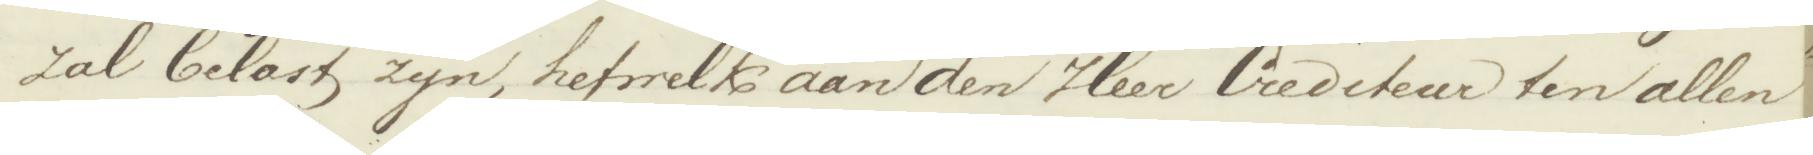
zal belast zijn, hetwelk aan den Heer Crediteur ten allen
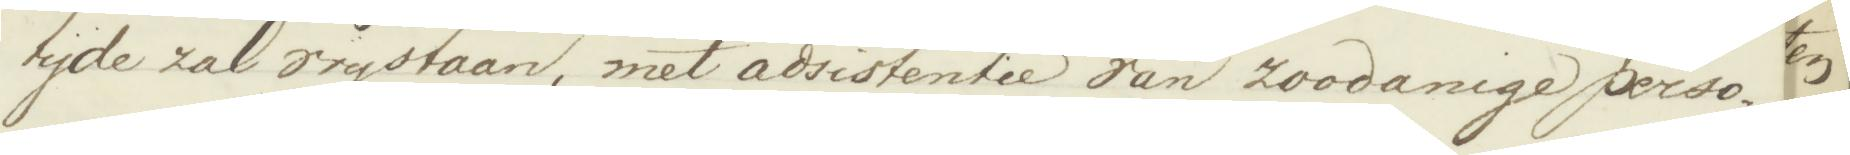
tijde zal vrijstaan, met adsistentie van zoodanige perso„
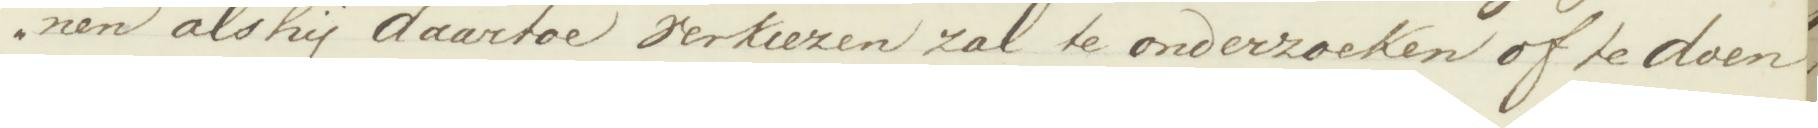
„nen als hij daartoe verkiezen zal te onderzoeken of te doen
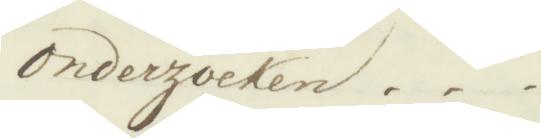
onderzoeken - -
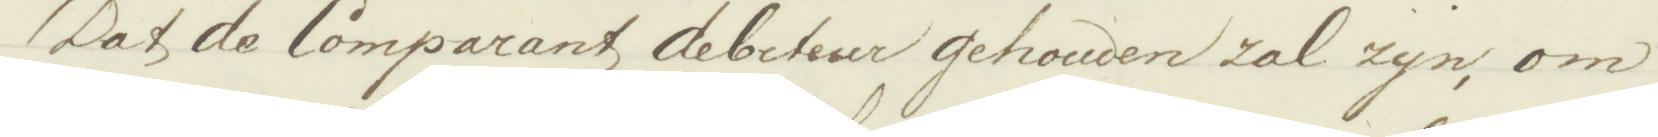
Dat de Comparant debiteur gehouden zal zijn, om
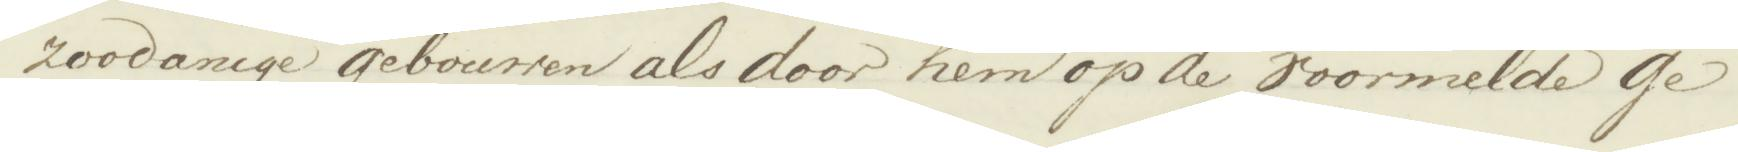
zoodanige gebouwen als door hem op de voormelde ge
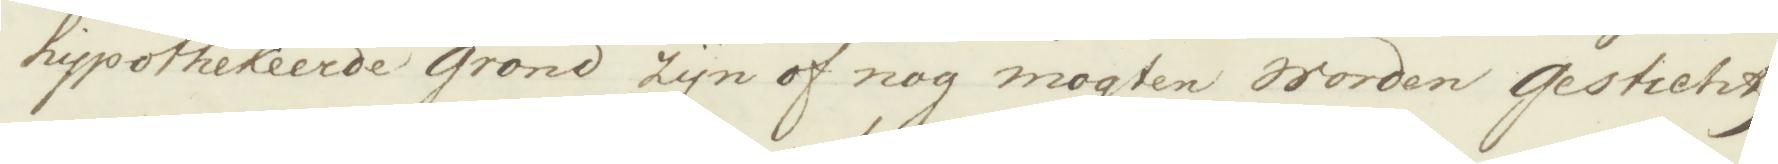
hijpothekeerde grond zijn of nog mogten worden gesticht
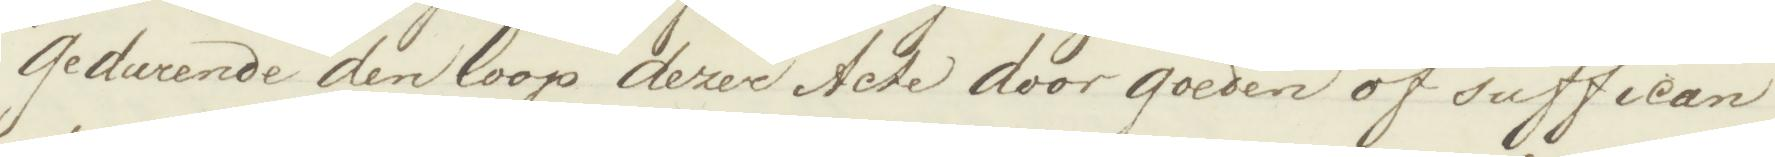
gedurende den loop dezer Acte door goeden of suffican
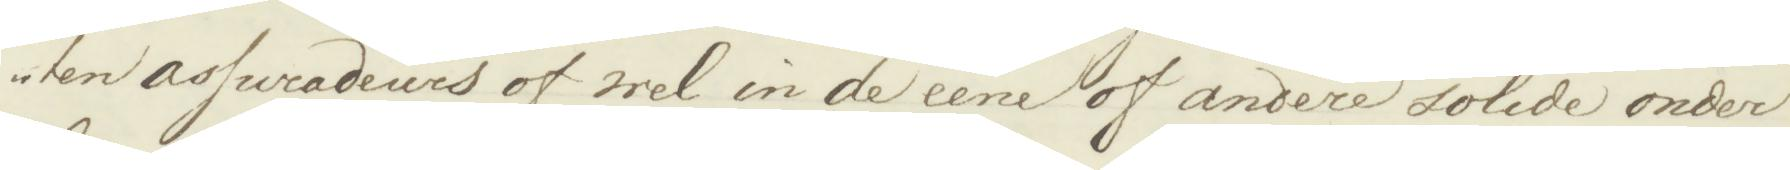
ten assuradeurs of wel in de eene of andere soide onder
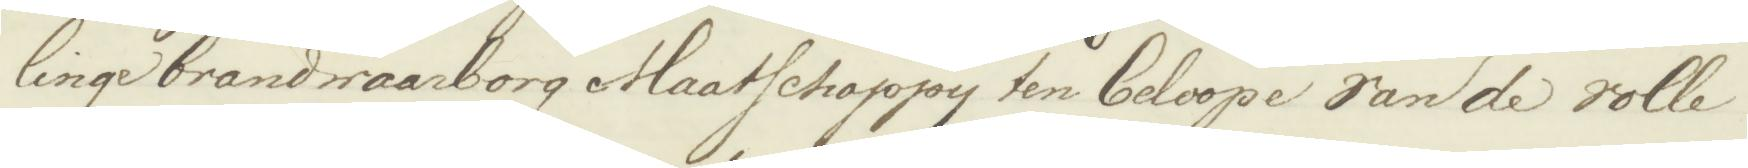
linge brandwaarborg Maatschappy ten beloope van de volle
